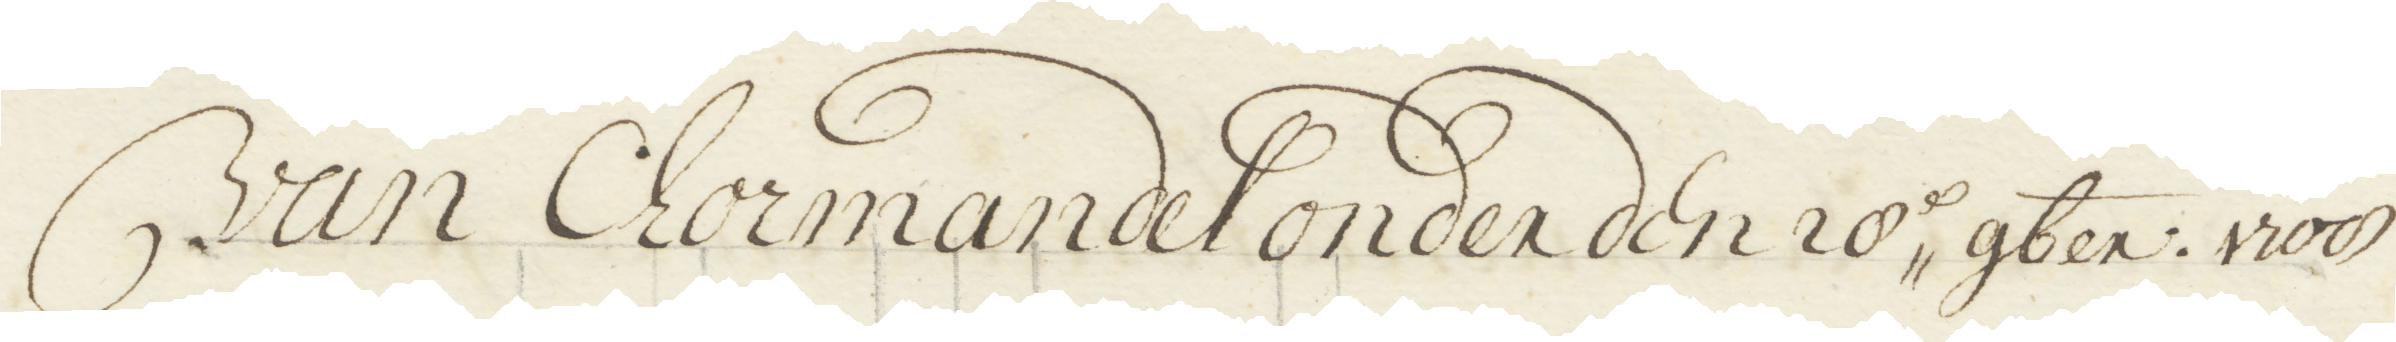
Van Chormandel onder den 28„e gber: 1708
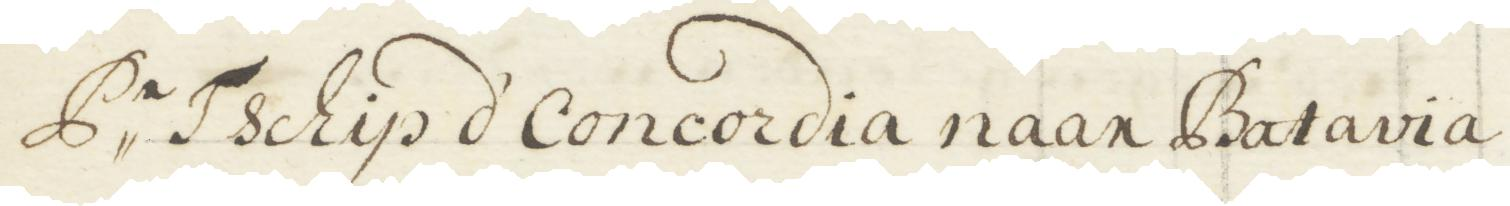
P„r T schip d’ Concordia naar Batavia
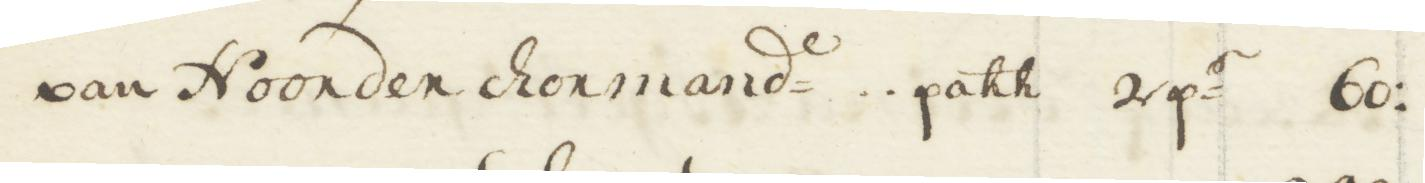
van Noorder chormand=l . . pakk 2 p=s 60:
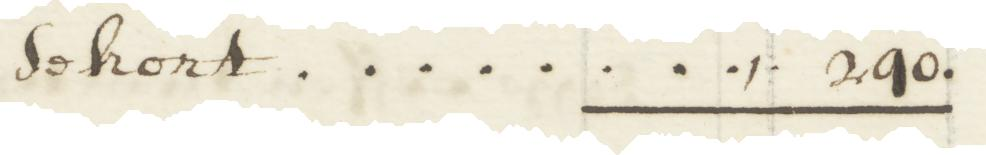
te kort. . . . . . . ./. 240.
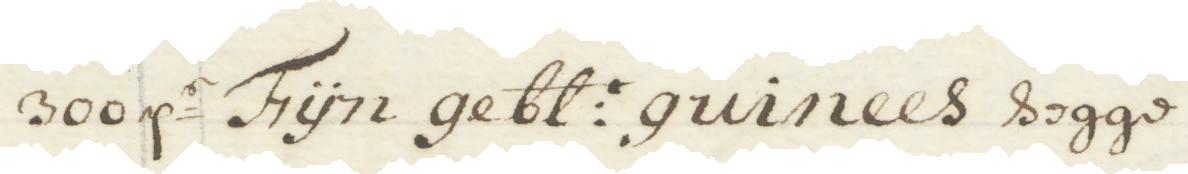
300 p=s Fijn gebl: guinees segge
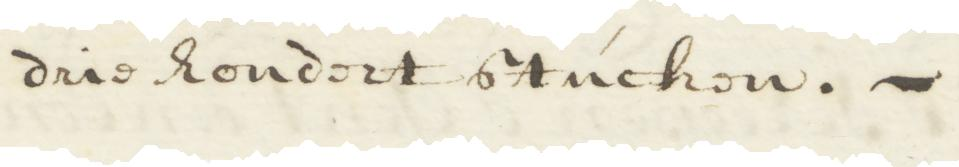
drie hondert stucken. —
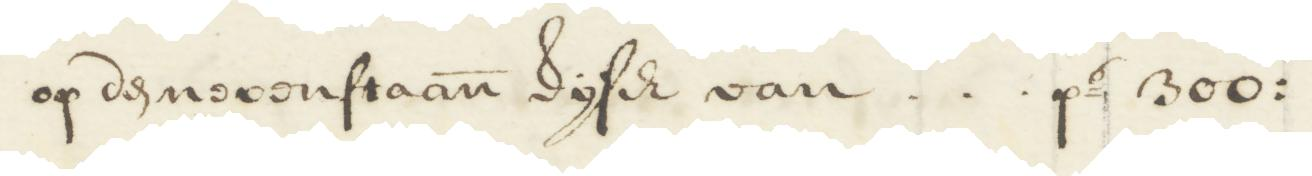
op den nevenstaan Eijsch van . . . p=s 300:
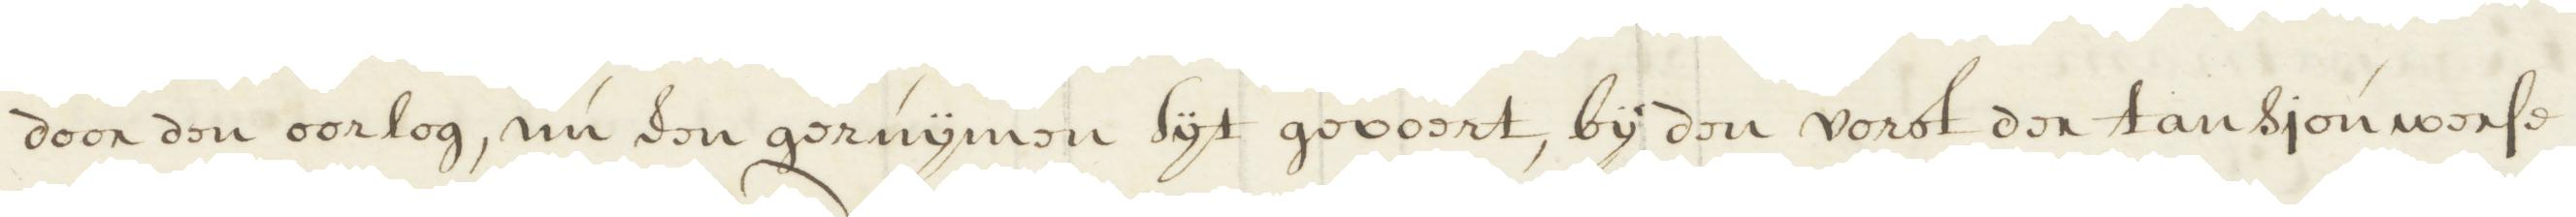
door den oorlog, nu Een geruijmen tijt gevoert, bij den vorst der tansjouwerse
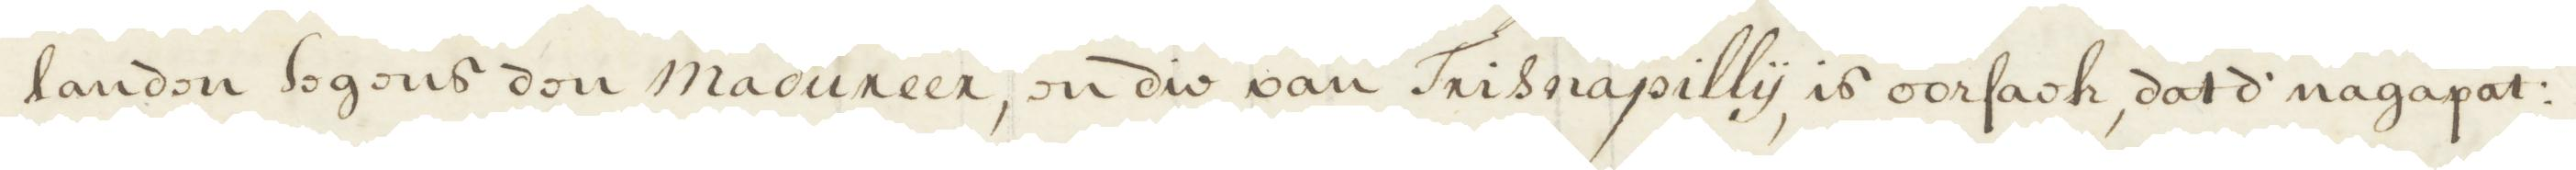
landen tegens den Madureer, en die van Trisnapillij, is oorsaek, dat d’ nagapat:
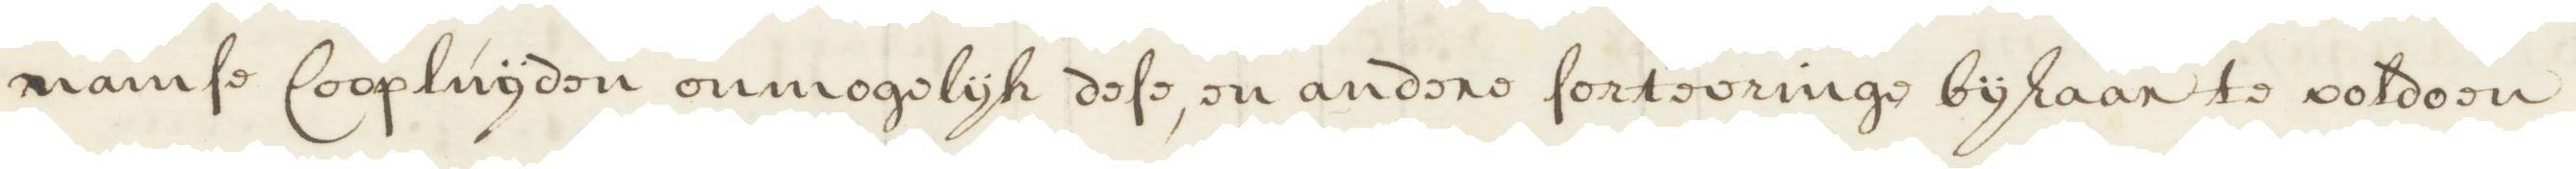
namse Coopluijden onmogelijk dese, en andere sorteeringe bijhaar te voldoen
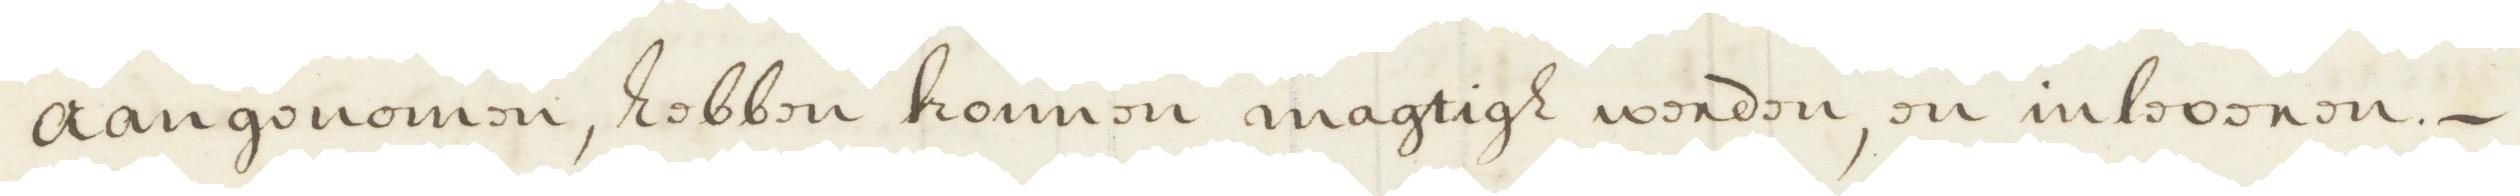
aangenomen, hebben konnen magtigh werden, en inleveren.—
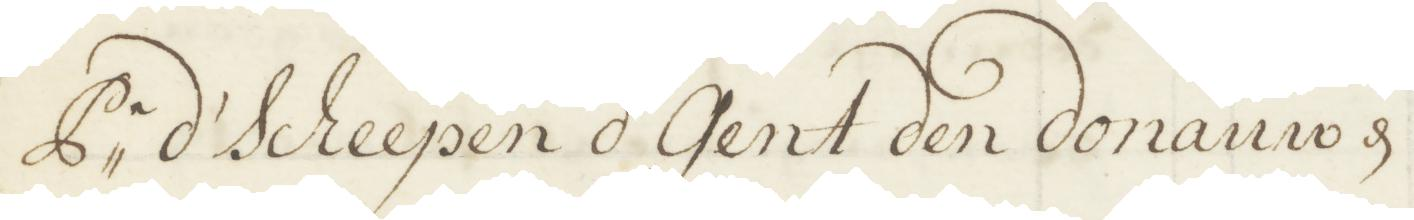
P„r d’ scheepen d’Gent den donauw en
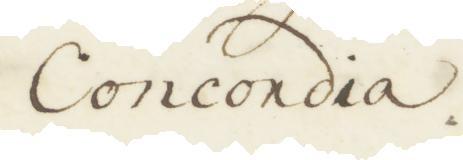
Concordia.
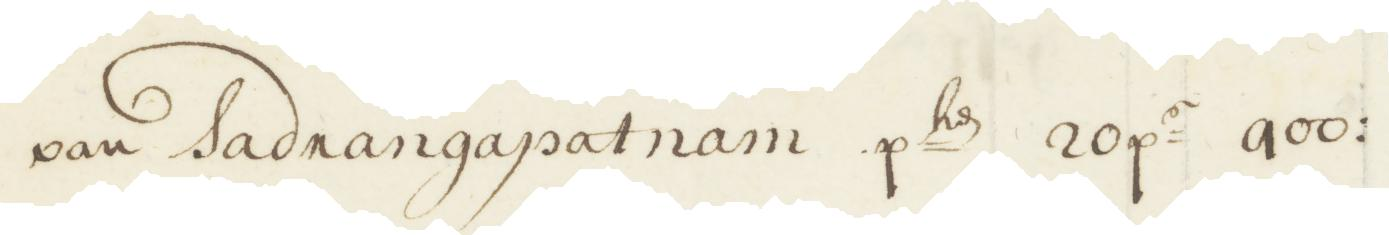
van Sadrangapatnam p=ken 20 p=s 400:
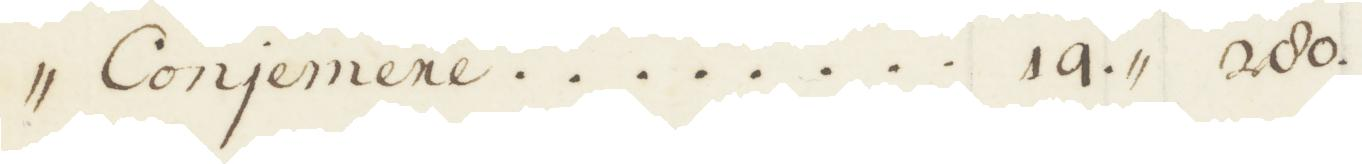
„ Conjemere . . . . . . . . 14.„ 280.
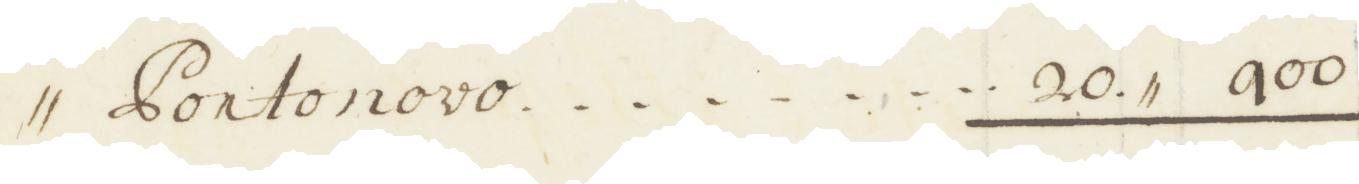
„ Portonovo - - - - - - - - - 20. „ 400
